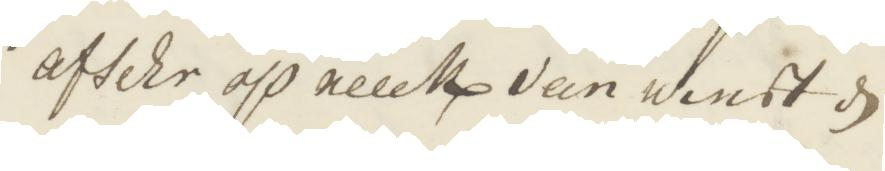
afschr op reeck van winst en
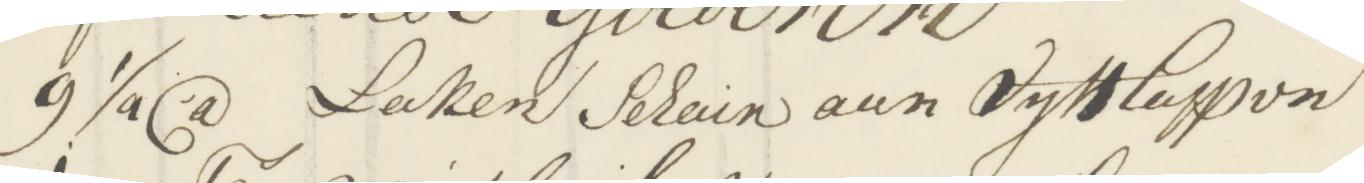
9¼ @ Laken schair aan vyff lappen
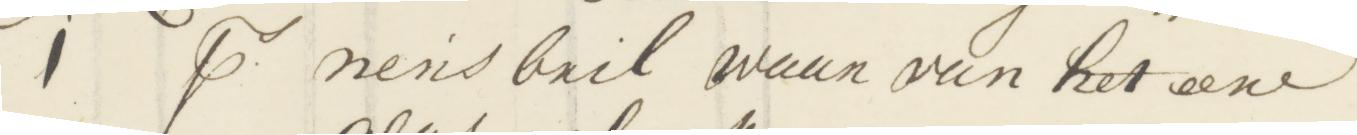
1 p.s neus bril waar van het eene
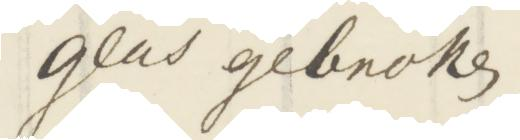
glas gebroken
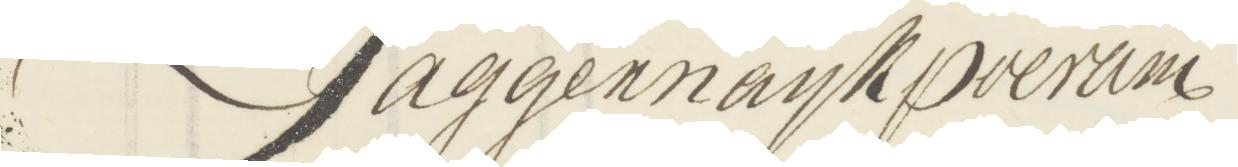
Jaggernayk poeram
